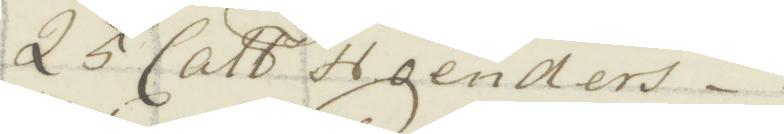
25 Catts Hoenders -
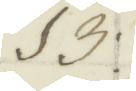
13:
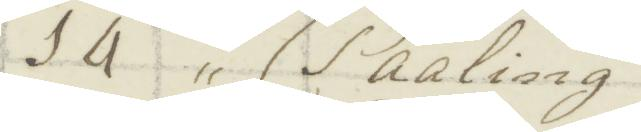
14 „ Paaling
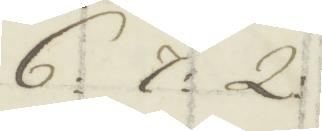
6: 7: 2:
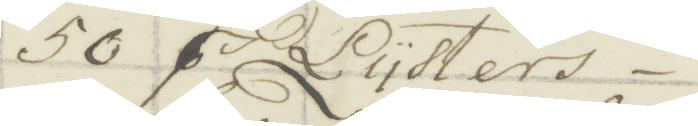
50 ps Lijsters -
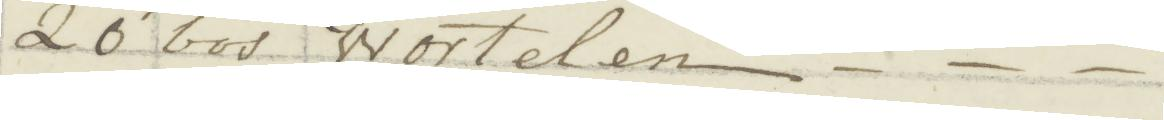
20 bos Wortelen - - -
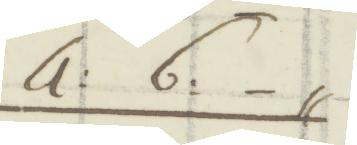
4: 6: -„
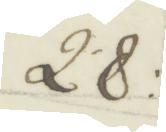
28:
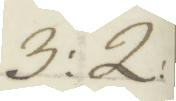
3: 2:
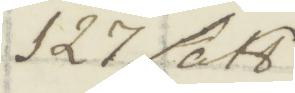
127 Catts
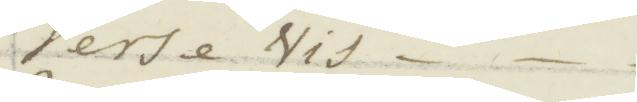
Verse vis
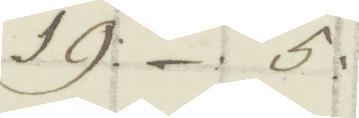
19: -: 5:
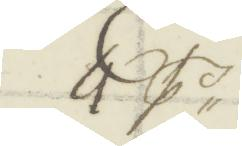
4 p„s
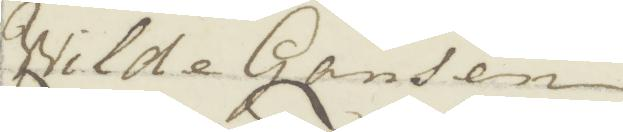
Wilde Gansen
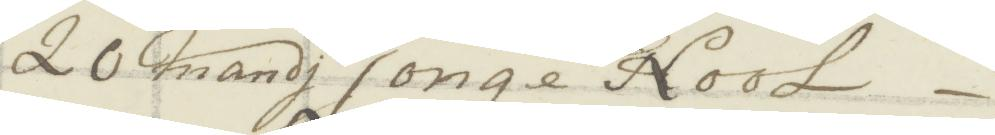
20 mandj Jonge Kool
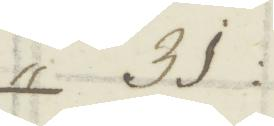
„ 31:
